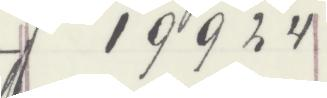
ƒ 19924
